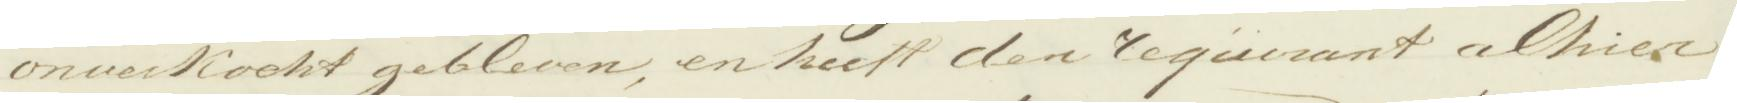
onverkocht gebleven, en heeft den requirant alhier
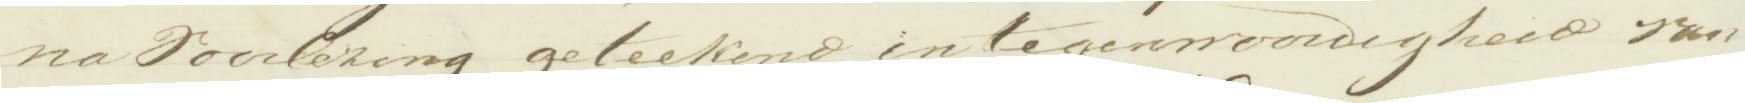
na voorlezing geteekend, in tegenwoordigheid van
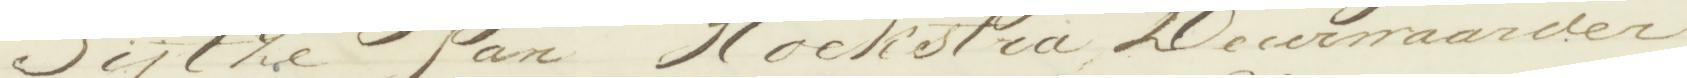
Sijtze Jan Hoekstra, Deurwaarder
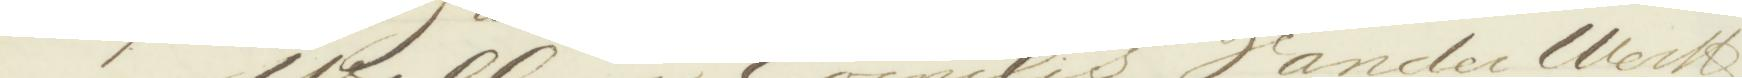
en Willem Cornelis Van der Werff
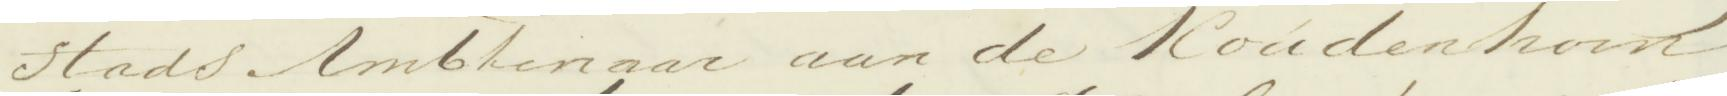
stads Ambtenaar aan de Koudenhorn
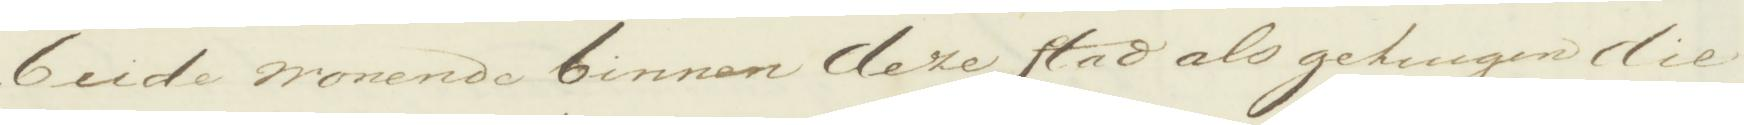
beide wonende binnen deze stad als getuigen die
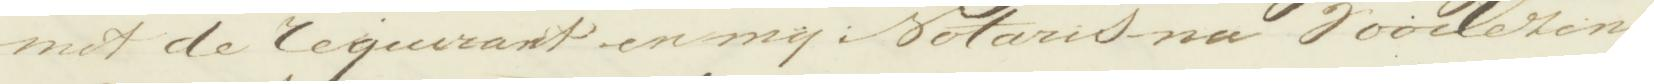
met de requirant en mij Notaris na voorlezen
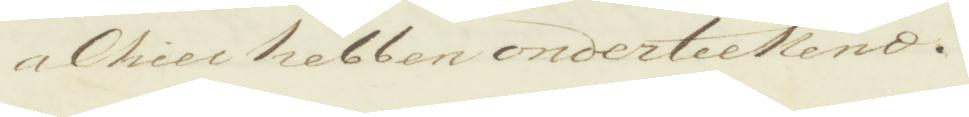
alhier hebben onderteekend.
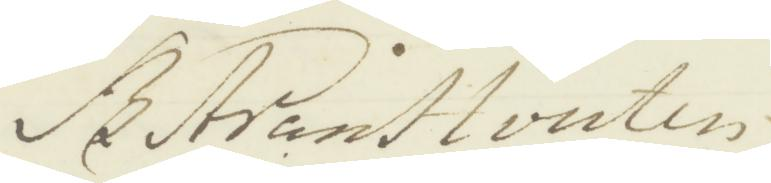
B AvanHouten
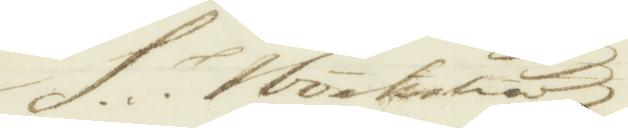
S.J. Hoekstra
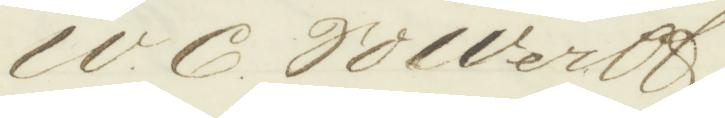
W. C. VdWerff
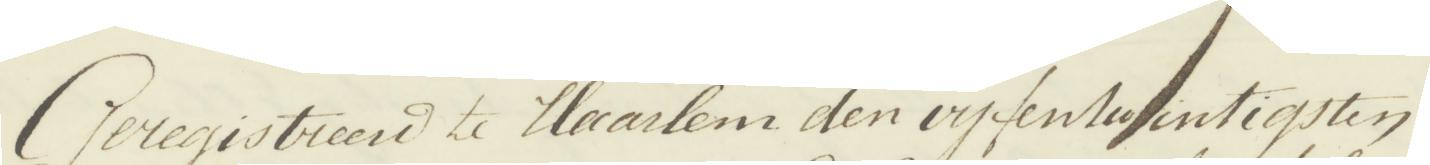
Geregistreerd te Haarlem den vyfentwintigsten
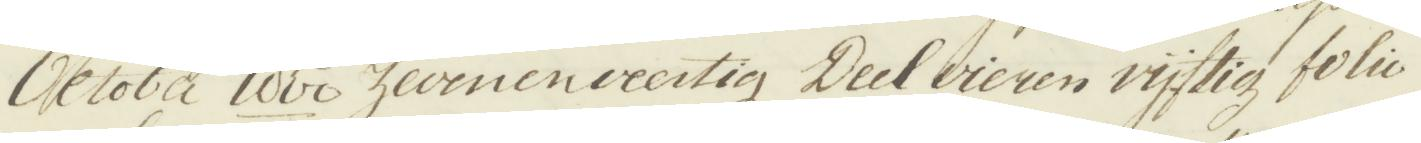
October 1800 zevenenveertig Deel vieren vijftig folio
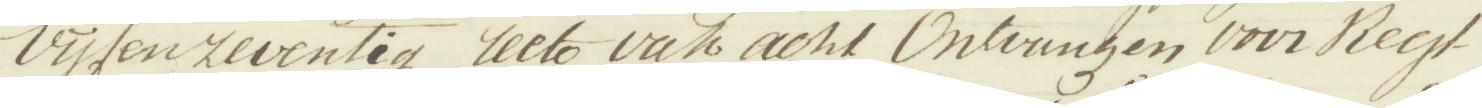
vijfenzeventig recto vak acht Ontvangen voor Regt
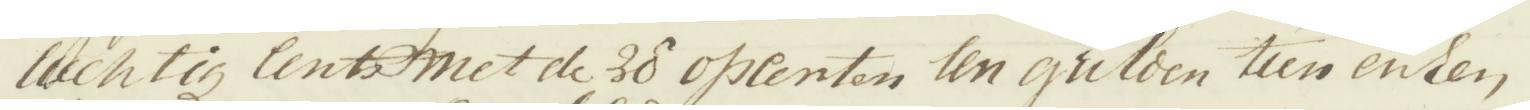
tachtig cents met de 38 opcenten Een gulden tien en Een
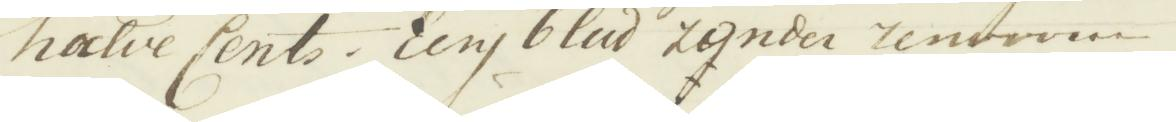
halve Cents. Een blad zonder renvooi
